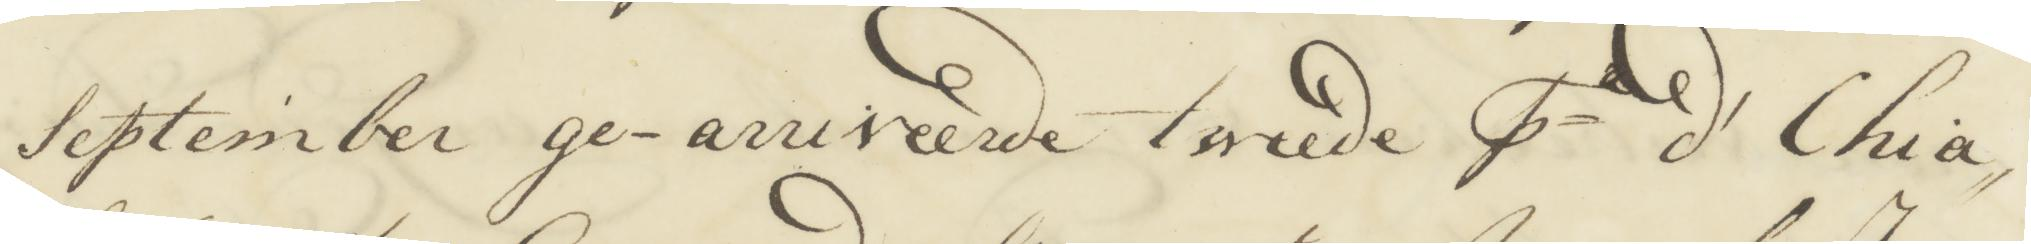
september ge-arriveerde tweede p=r d' Chia„
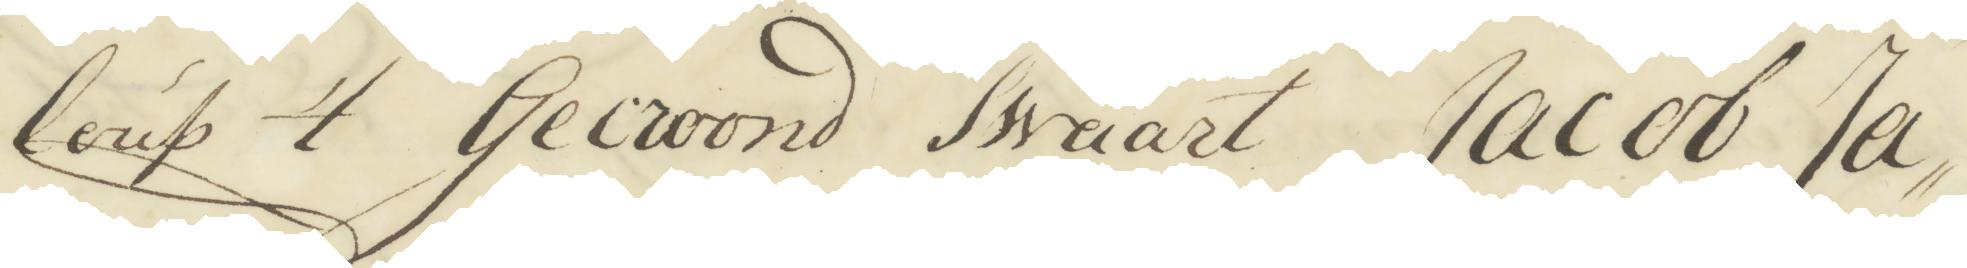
loup ’t Gecroond Swaart Jacob Ja„
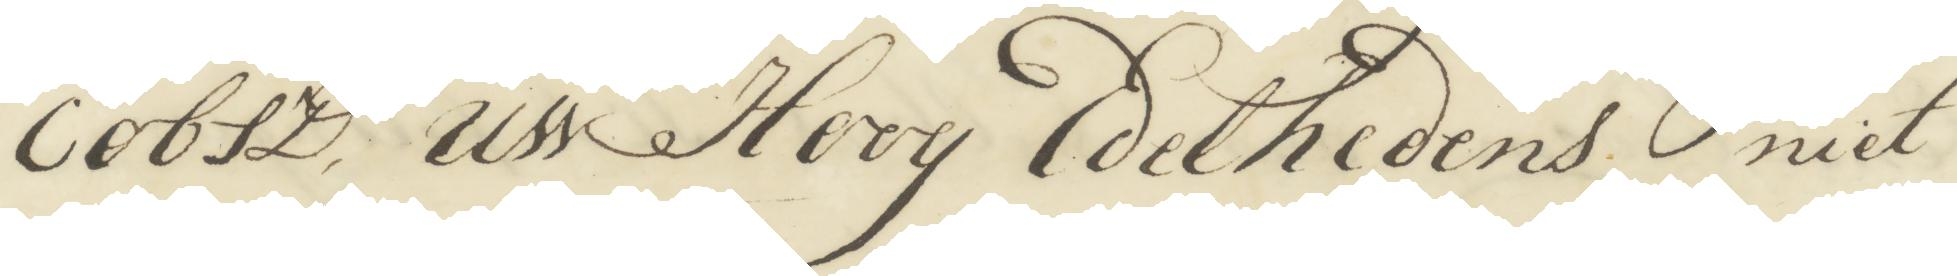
cobsz, uw Hoog Edelhedens niet
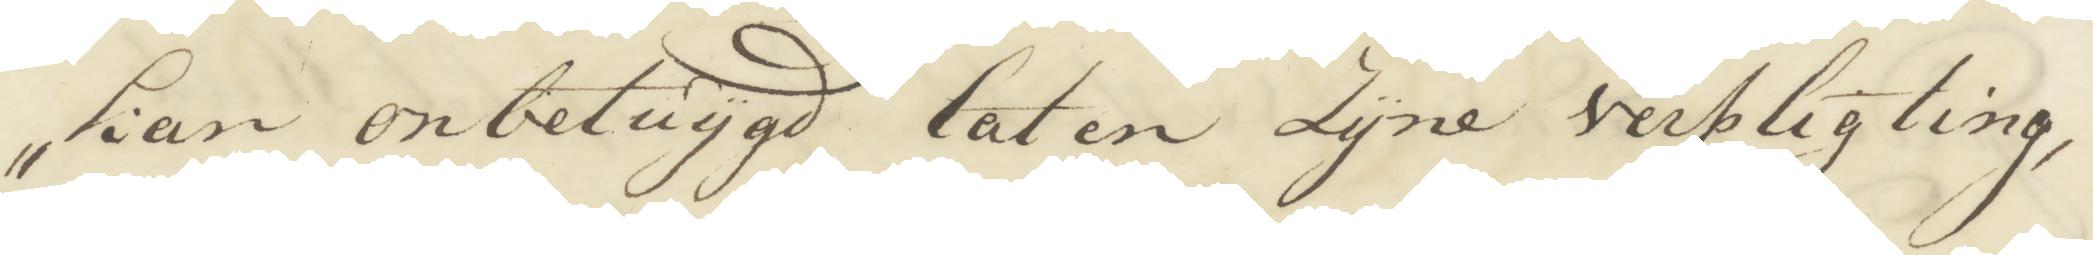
„kan onbetuijgd laten zijne verpligting,
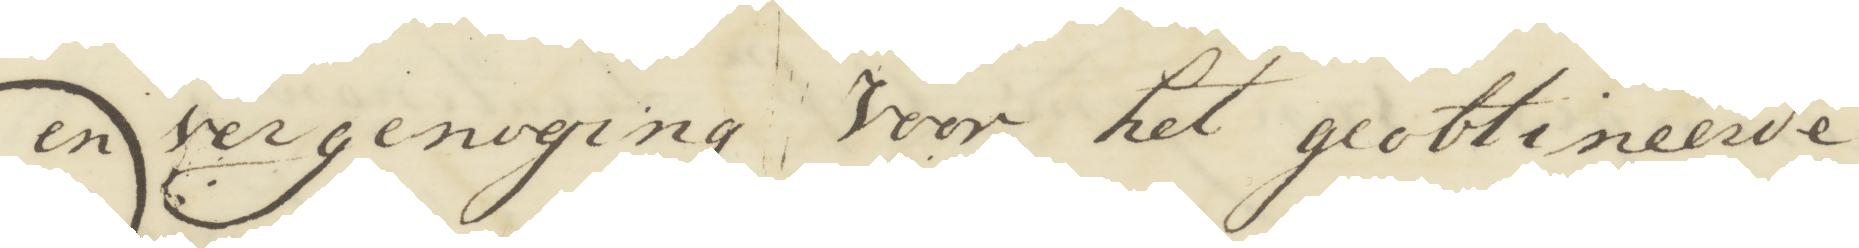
en vergenoging voor het geobtineerde
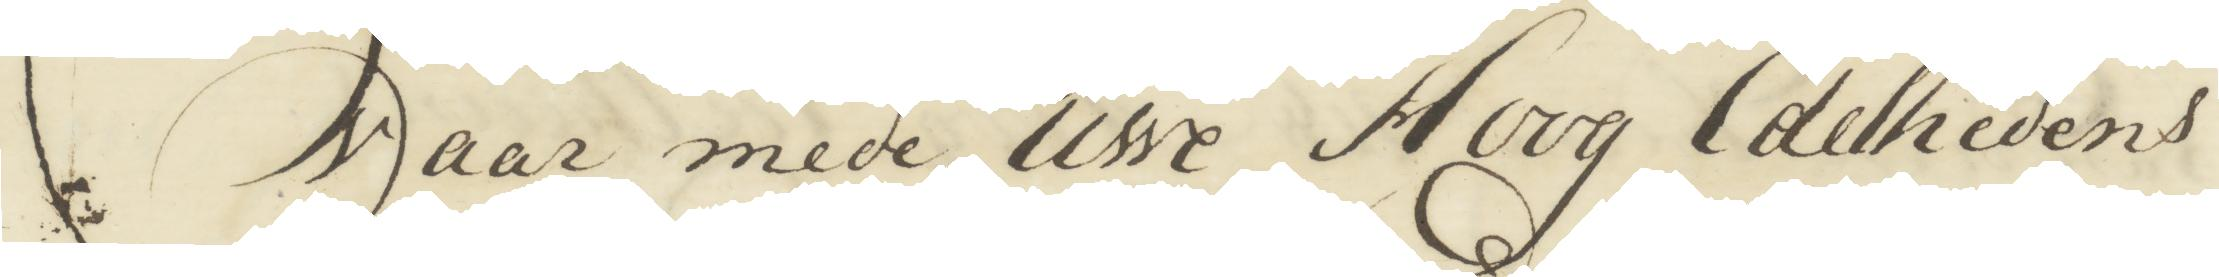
Waar mede Uwe Hoog Edelhedens
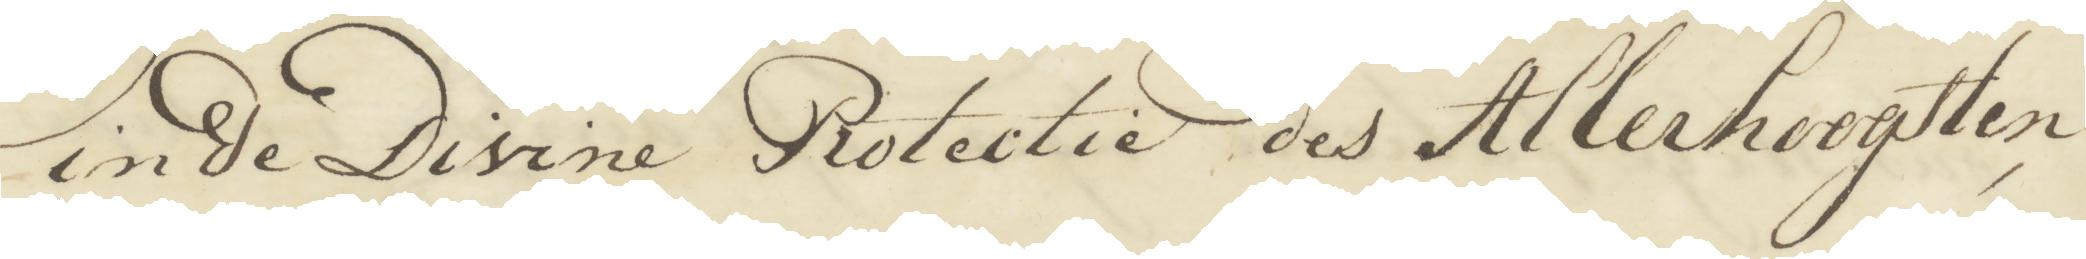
in de Divine Protectie des Allerhoogsten,
